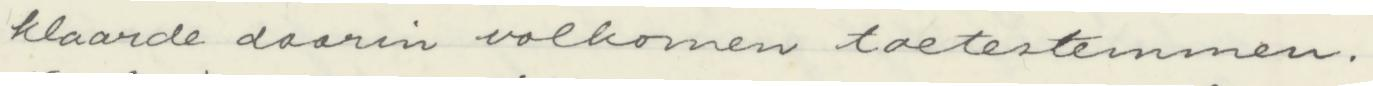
klaarde daarin volkomen toetestemmen.
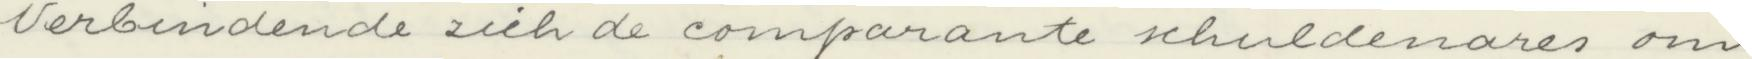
Verbindende zich de comparante schuldenares om
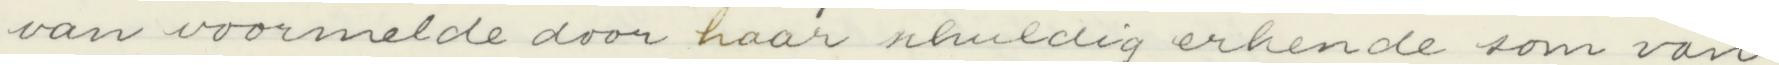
van voormelde door haar shuldig erkende som van
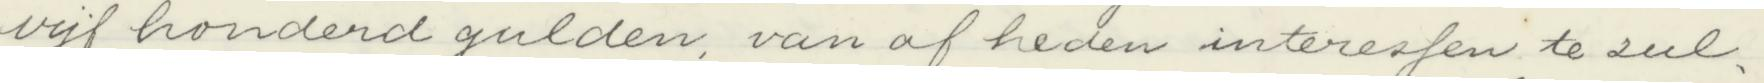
vijf honderd gulden, van af heden interessen te zul,
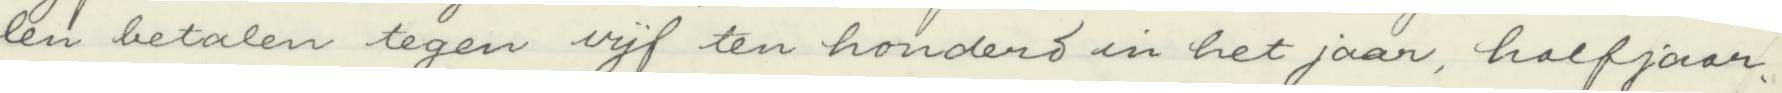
len betalen tegen vijf ten honderd in het jaar, halfjaar,
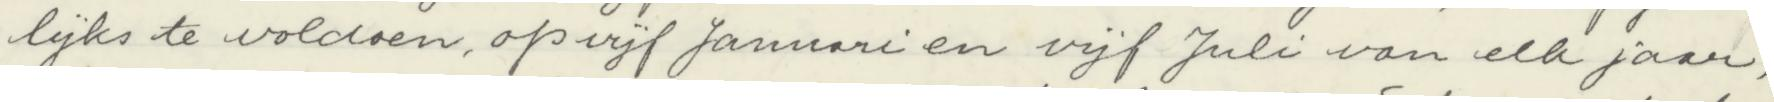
lijks te voldoen, op vijf Januari en vijf Juli van elk jaar,
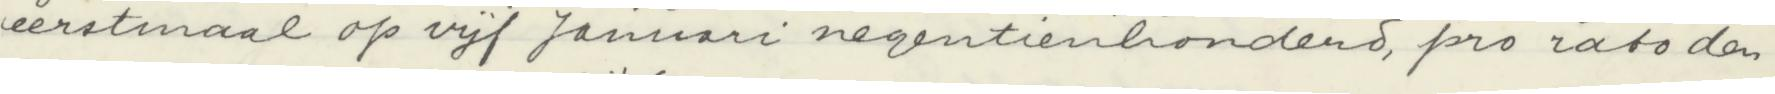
eerstmaal op vijf Januari negentienhonderd, pro rato den
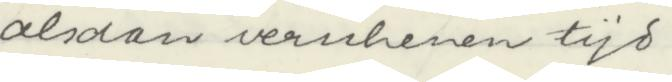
alsdan verschenen tijd
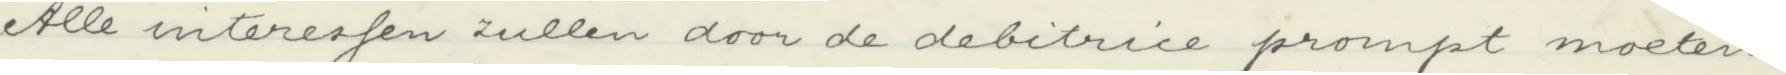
Alle interessen zullen door de debitrice prompt moeten
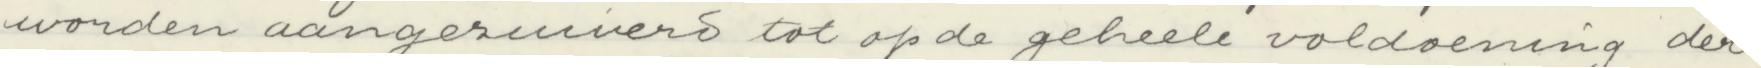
worden aangezuiverd tot op de geheele voldoening der
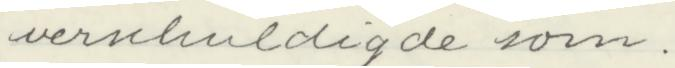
verschuldigde som
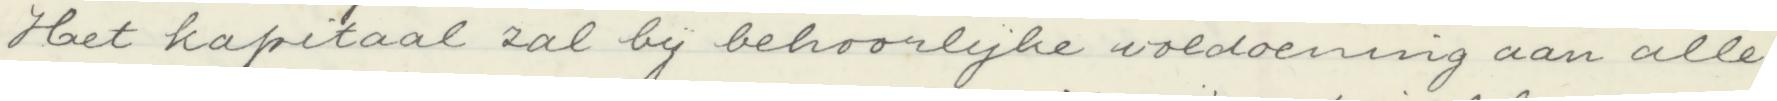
Het kapitaal zal bij behoorlijke voldoening aan alle
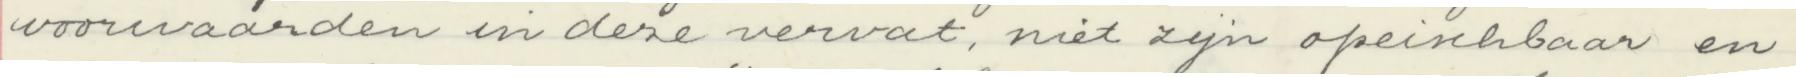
voorwaarden in deze vervat, niet zijn opeischbaar en
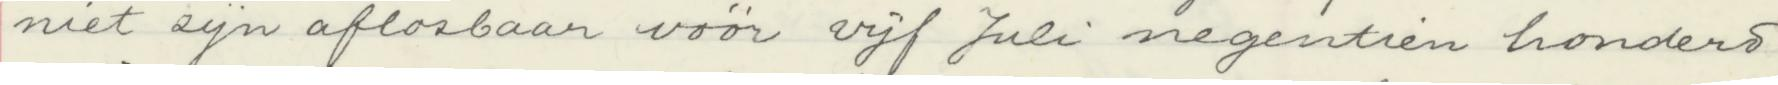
niet zijn aflosbaar vóór vijf Juli negentien honderd
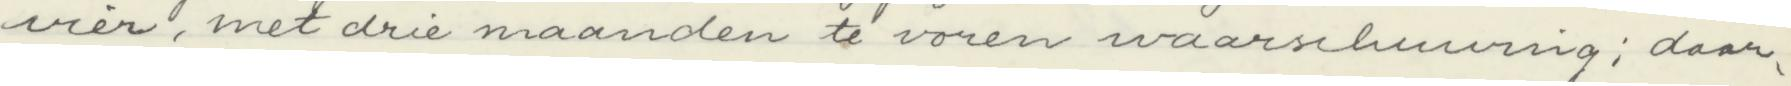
vier, met drie maanden te voren waarschuwing; daar,
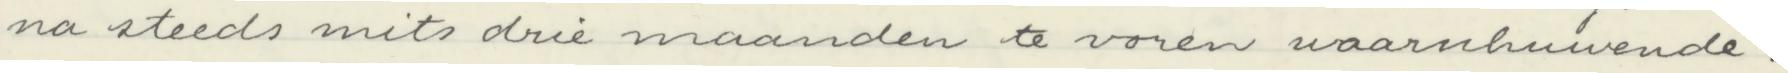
na steeds mits drie maanden te voren waarschuwende.
